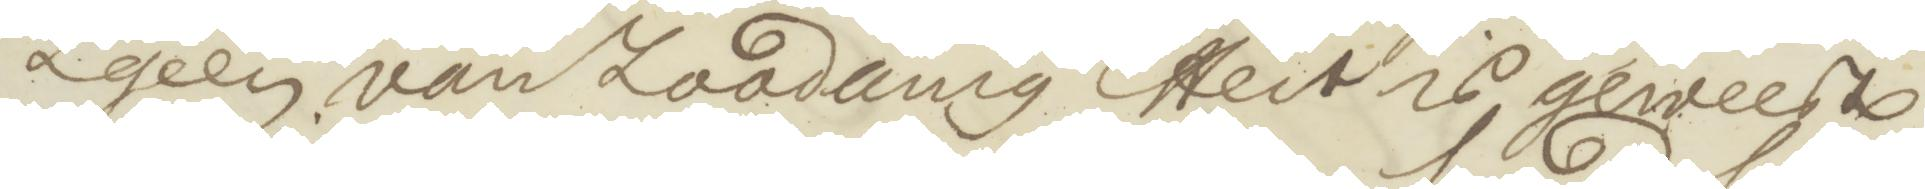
tgeen van zoodanig Effect is geweest
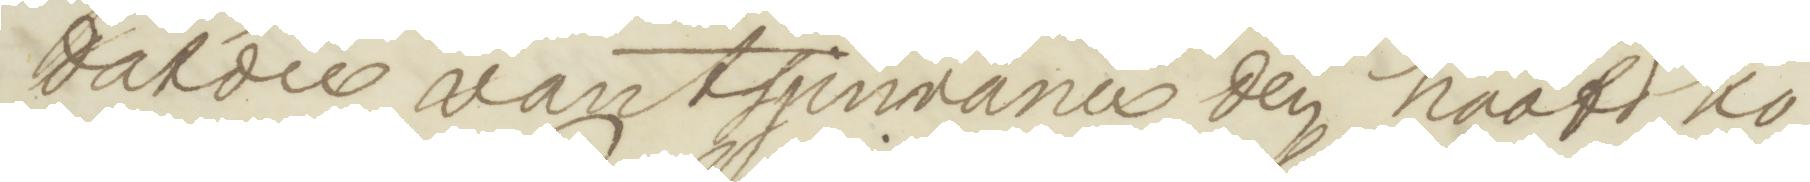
dat die van tsjinrana den hoofd ko
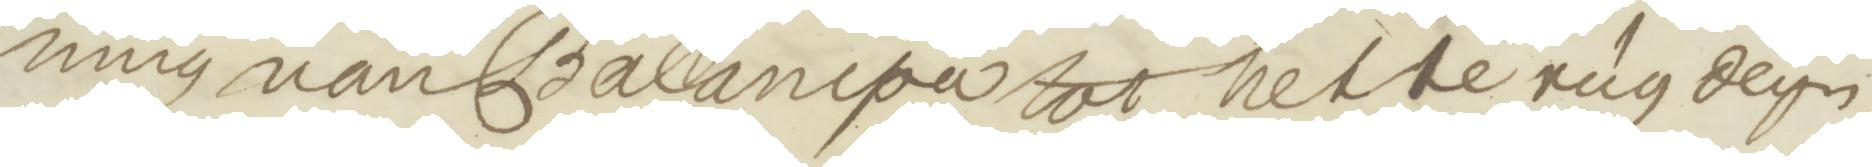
ning van Balanipa tot het te rug deijn„
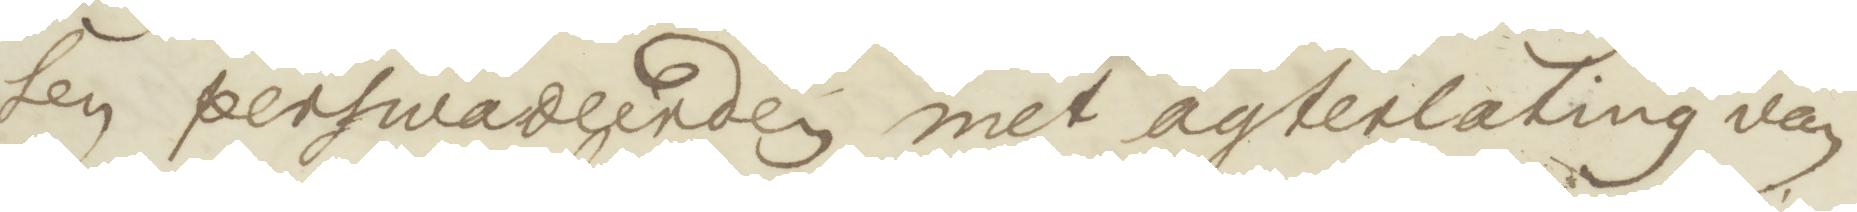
sen perswadeerden met agterlating van
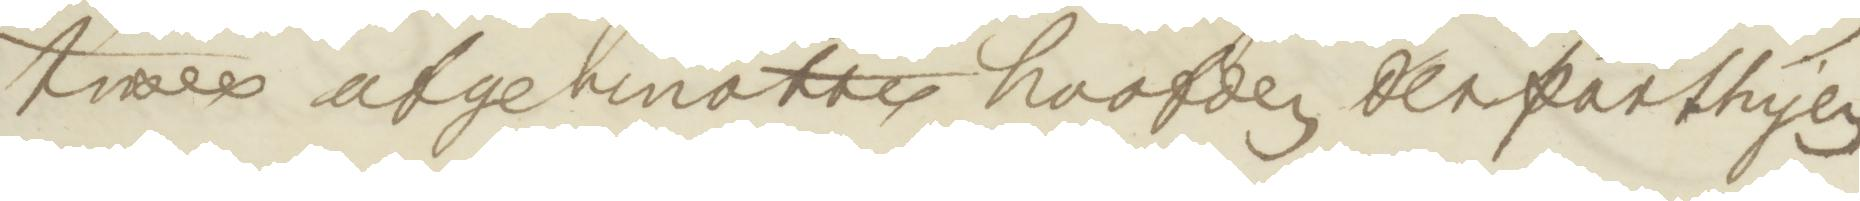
twee afgeknotte hoofden der parthijen
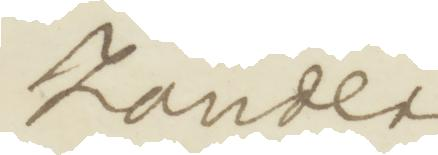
zonder
